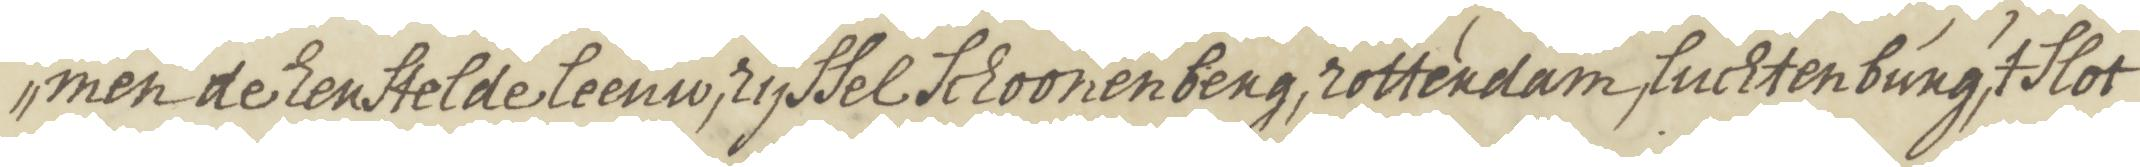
„men de herstelde leeuw, rijssel schoonenberg, rotterdam, luchtenburg, 't slot
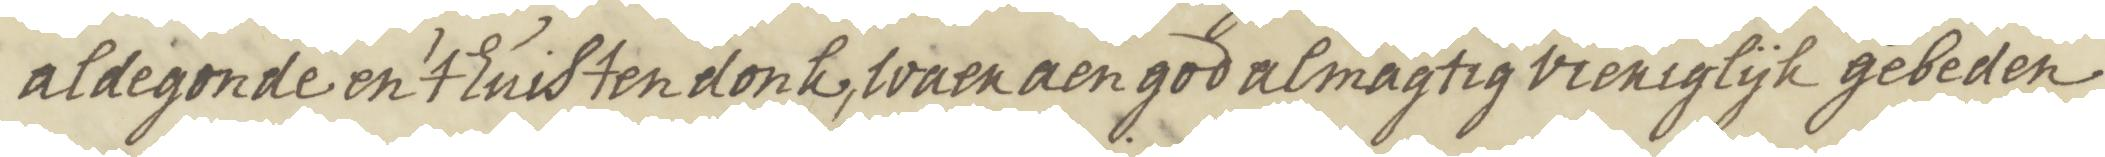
aldegonde en ’t huis ten donk, waer aen god almagtig vieriglijk gebeden
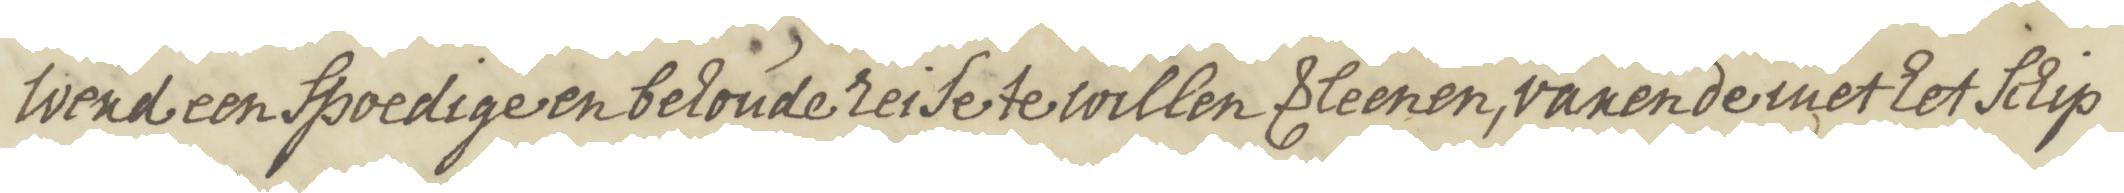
werd een spoedige en behoude reise te willen verleenen, varende met het schip
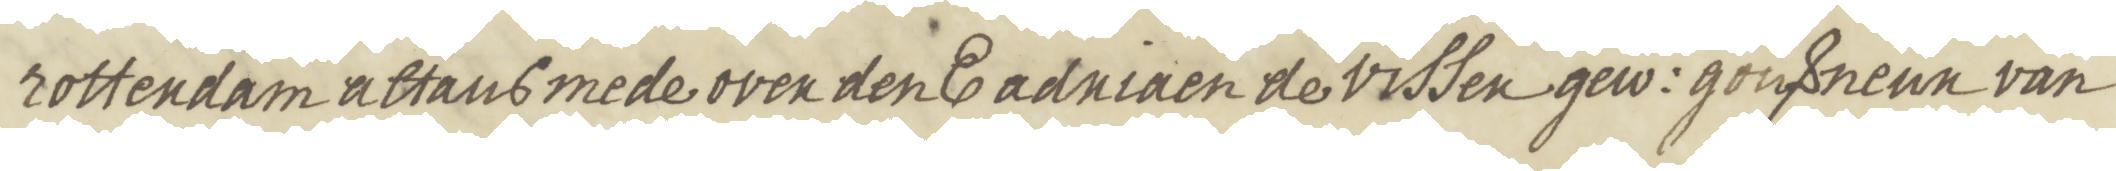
rotterdam altans mede over den E adriaen de visser gew: gouverneur van
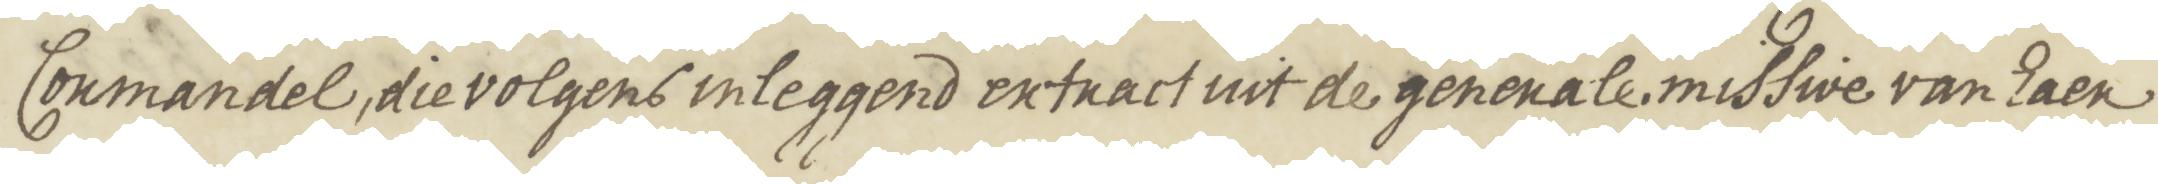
Cormandel, die volgens inleggend extract uit de generale missive van haer
